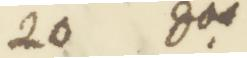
20 d:os
